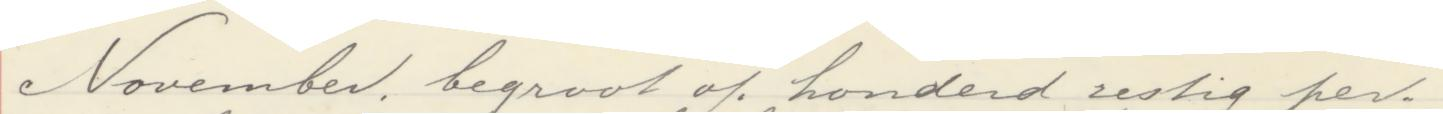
November, begroot op honderd zestig per-
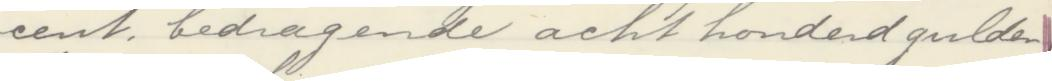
cent, bedragende acht honderd gulden
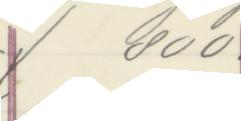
ƒ 800
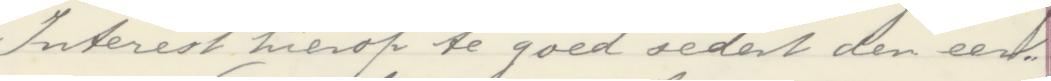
Interest hierop te goed sedert den eer„
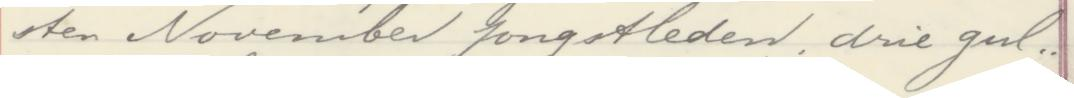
sten November Jongstleden, drie gul„
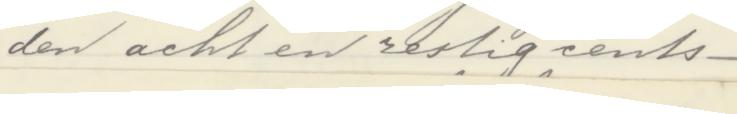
den acht en zestig cents
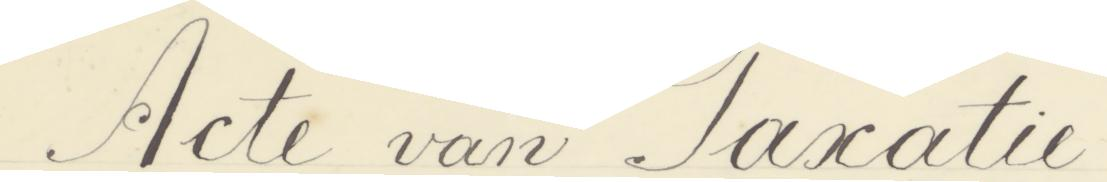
Acte van Taxatie
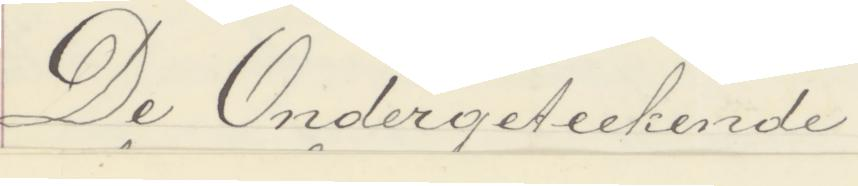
De Ondergeteekende
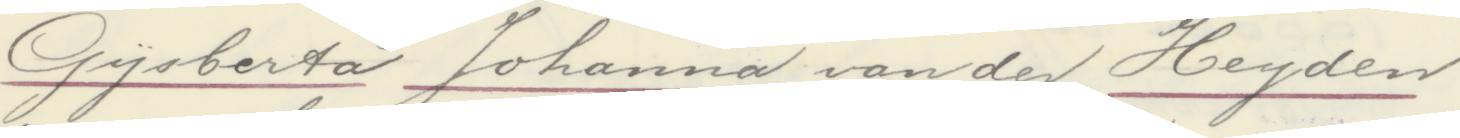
Gijsberta Johanna van der Heyden
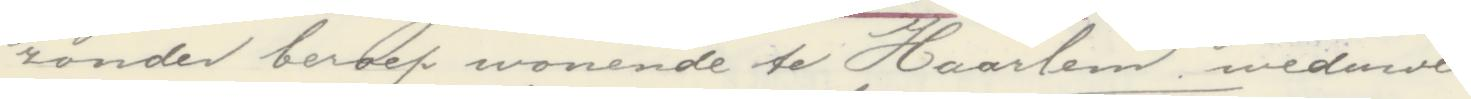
zonder beroep wonende te Haarlem, weduwe
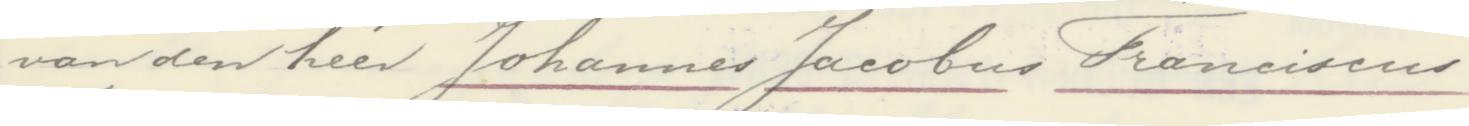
van den heer Johannes Jacobus Franciscus
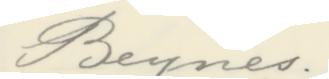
Beynes.
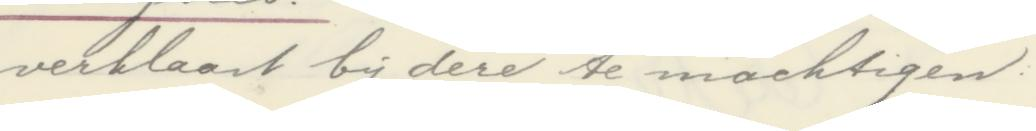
verklaart bij deze te machtigen.
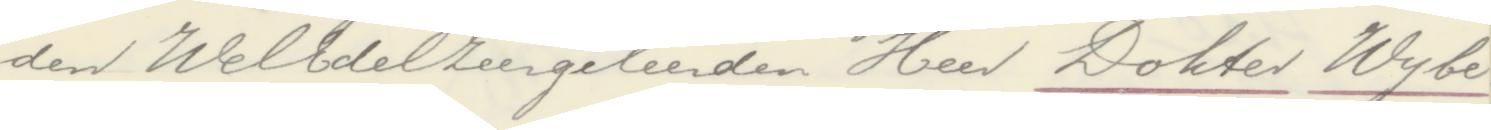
den WelEdelzeergeleerden Heer Dokter Wybe
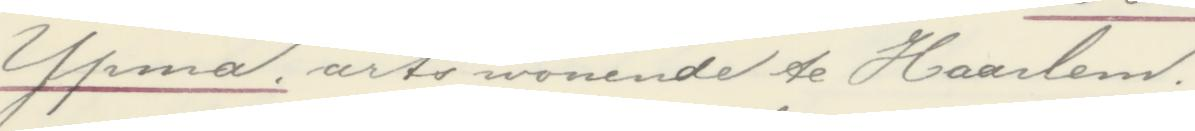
Ypma, arts wonende te Haarlem.
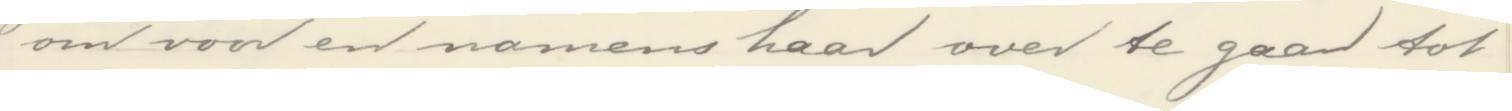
om voor en namens haar over te gaan tot
